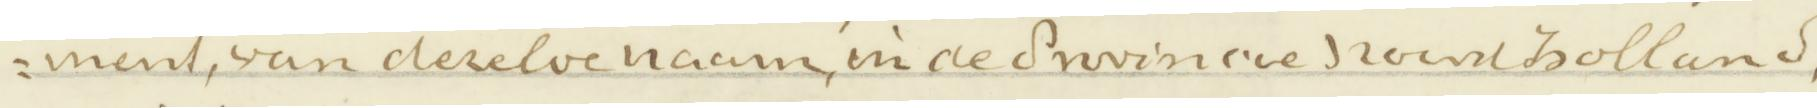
=ment, van dezelve naam, in de Provincie noord holland
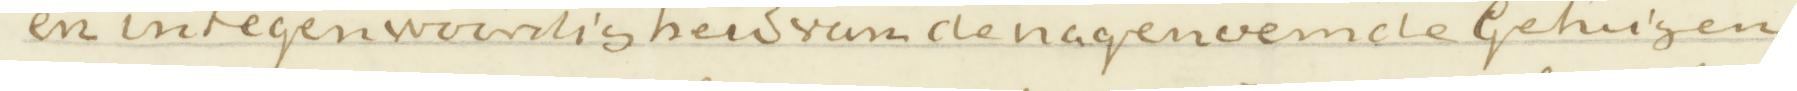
en integenwoordigheid van de nagenoemde Getuigen
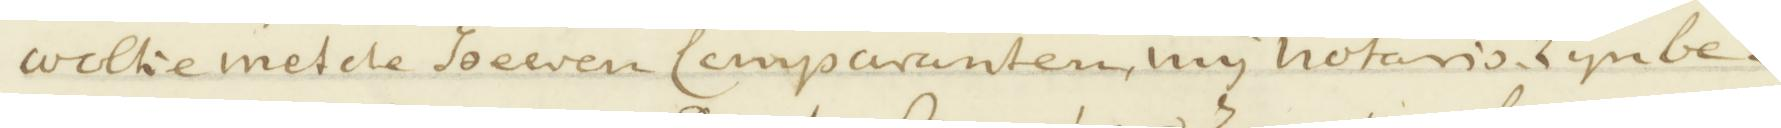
welke met de Heeren Comparanten, mij notaris, zyn be=
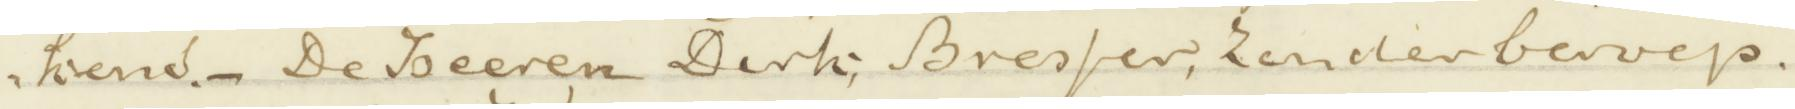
=kend. – De heeren Dirk; Bresser, zonder beroep.
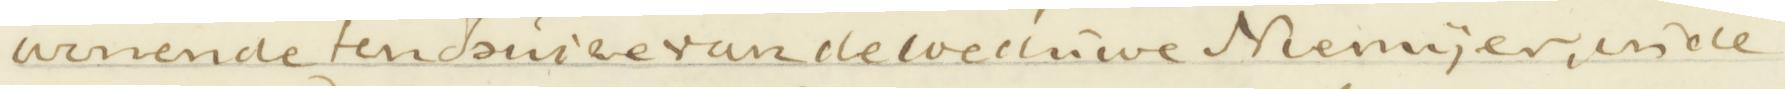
wonende ten huize van de weduwe Niemijer, in de
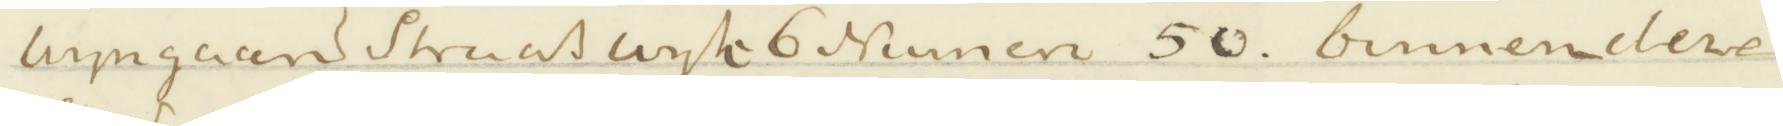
wyngaard straat wyk 6 Numero 50. binnen deze
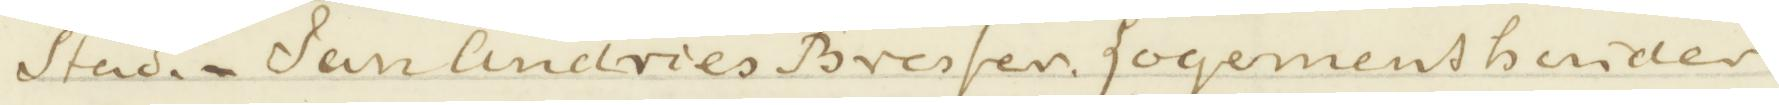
Stad. – Jan Andries Bresser, Logementhouder
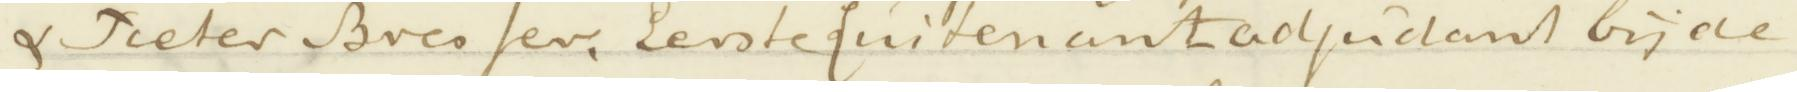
& Pieter Bresser, Eerste Luitenant adjudant bij de
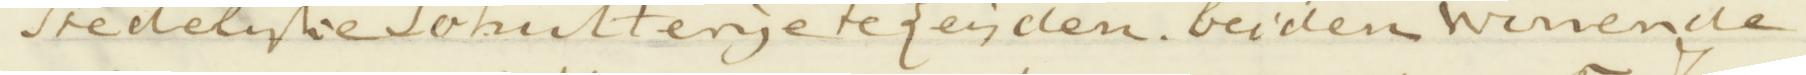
stedelyke schutterije te Leijden, beiden wonende
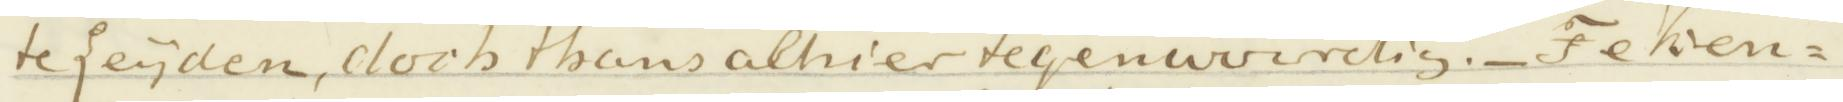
te Leijden, doch thans alhier tegenwoordig. _ Te Ken=
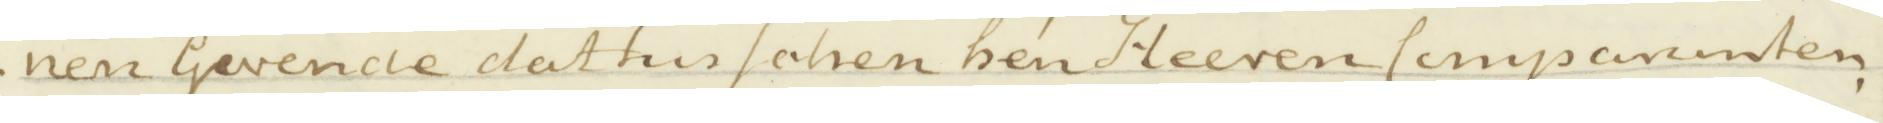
nen Gevende dat tusschen hen Heeren Comparanten,
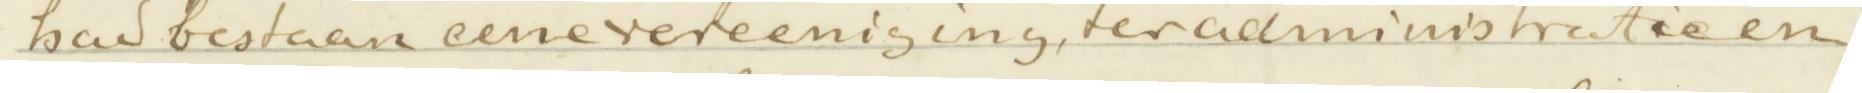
had bestaan eene vereeniging, ter administratie en
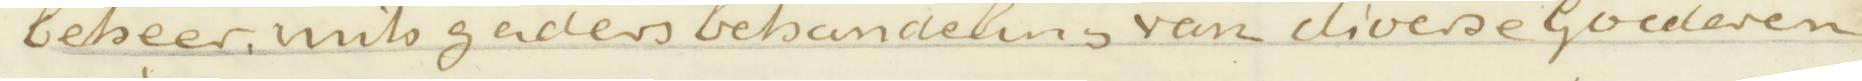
beheer, mitsgaders behandeling van diverse Goederen
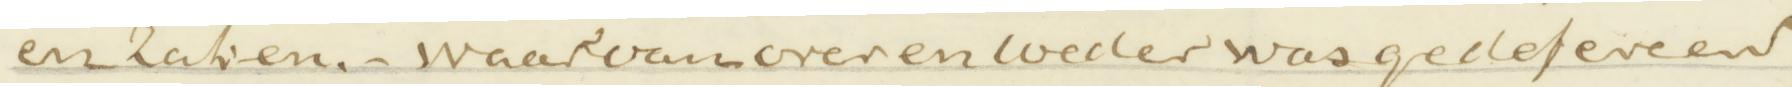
en zaken. – waarvan over en weder was gedefereerd
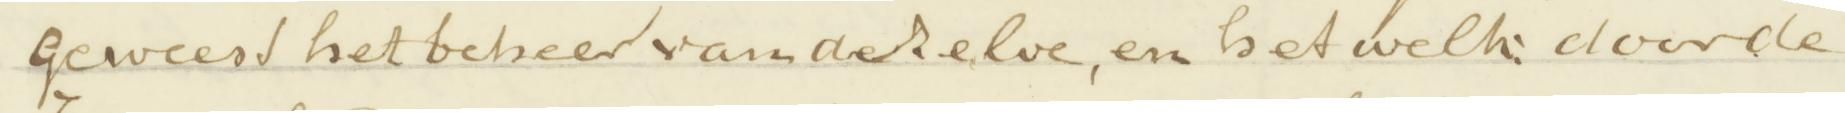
geweest het beheer van dezelve, en het welk door de
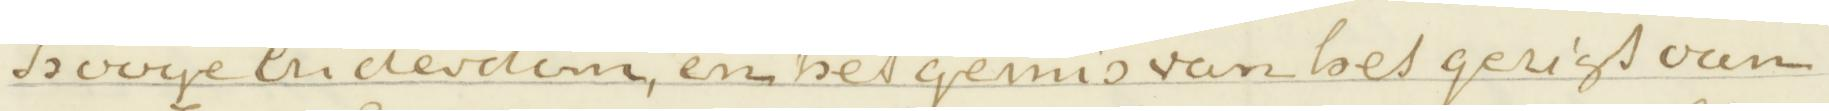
hooge ouderdom, en het gemis van het gezigt van
